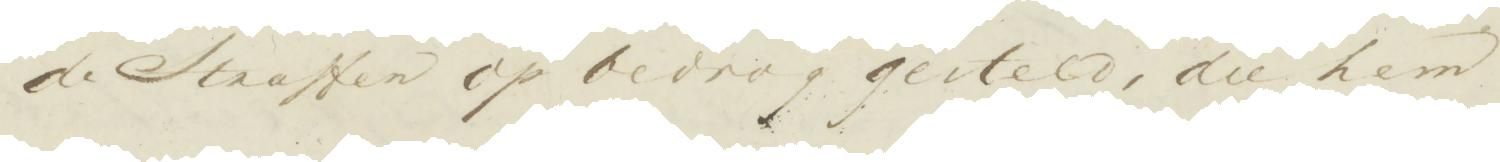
de Straffen op bedrog gesteld, die hem
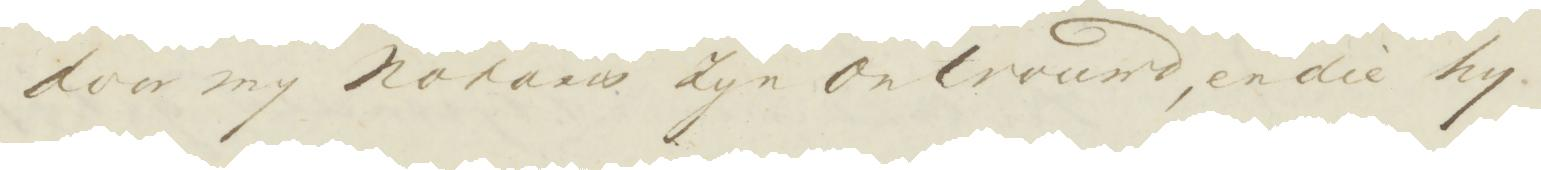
door my Notaris zyn ontvouwd, en die hy
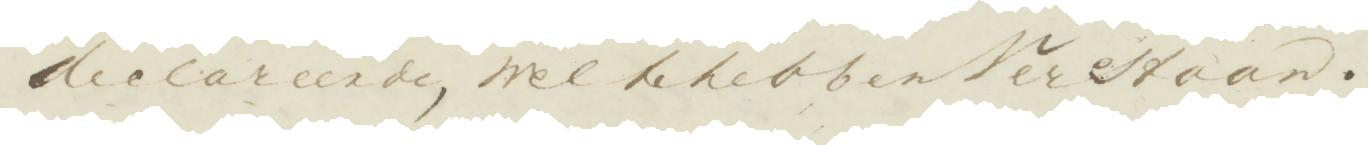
declareerde, wel te hebben Verstaan.
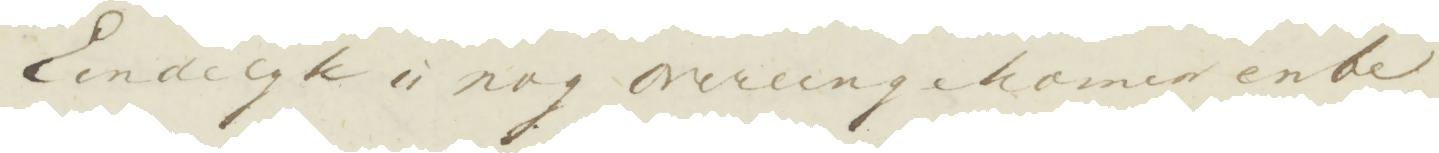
Eindelyk is nog overeengekomen en be
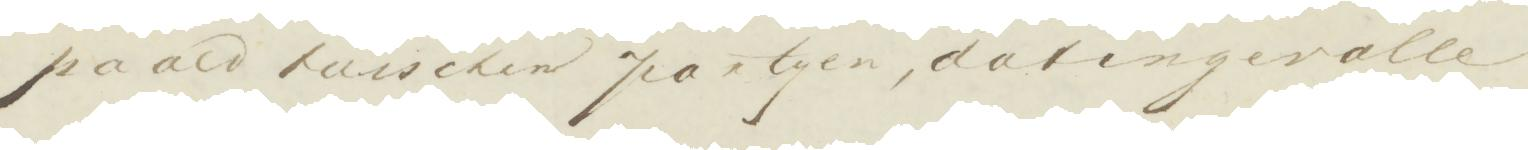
paald tuschen partyen, dat ingevalle
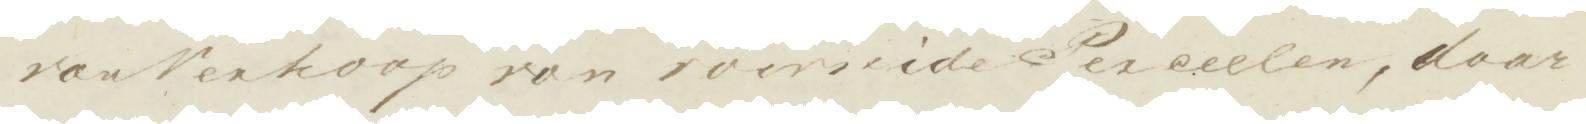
van Verkoop van voorseide Perceelen, daar
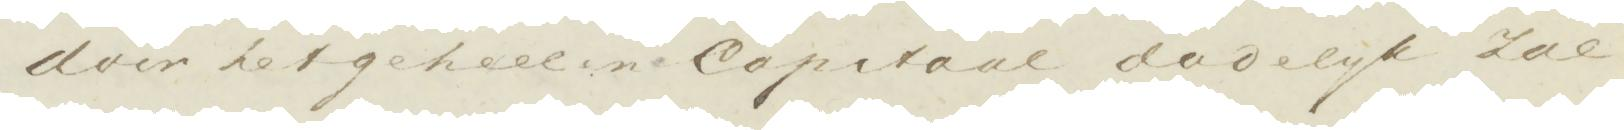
door het geheelen capitaal dadelijk zal
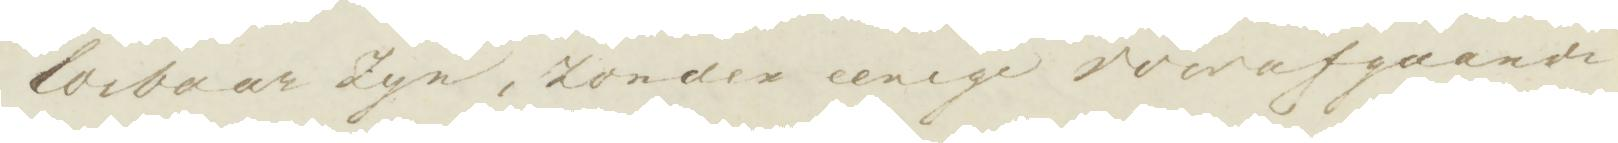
losbaar zyn, zonder eenige voorafgaande
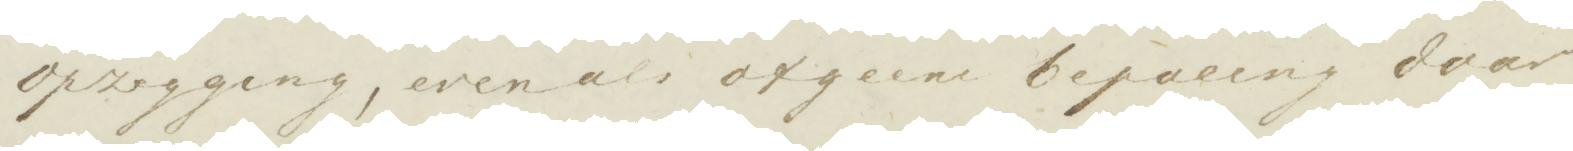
opzegging, even als of geene bepaling daar
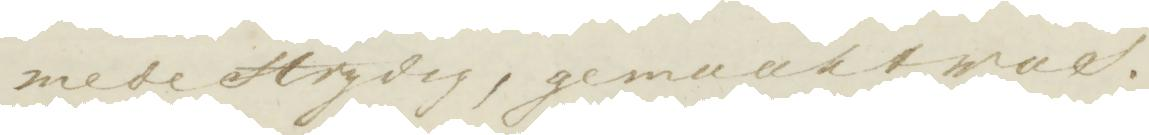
mede strydig, gemaakt was.
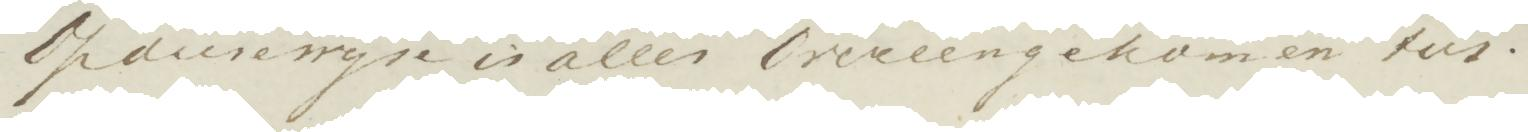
Op deese wyse is alles overeengekomen tus
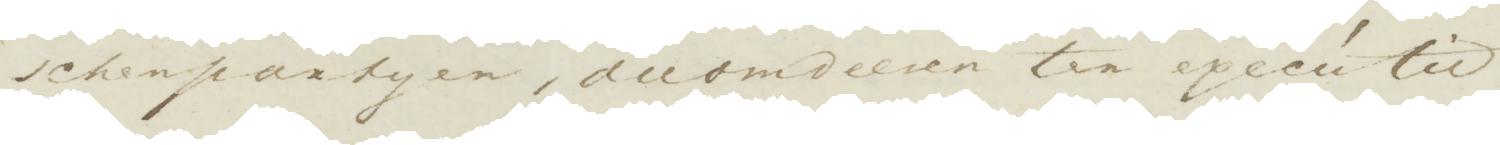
schen partyen, die omdeesen ter executie
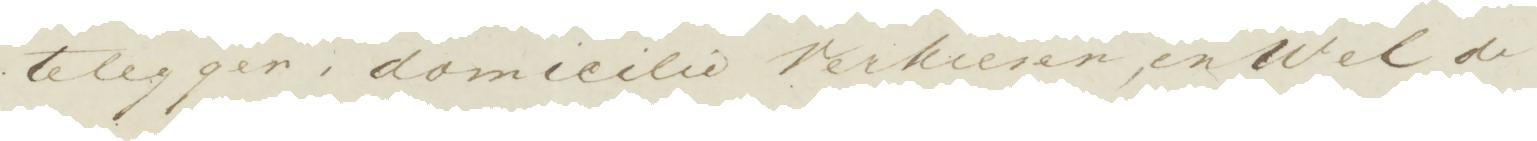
te leggen; domicilie verkiesen, en wel de
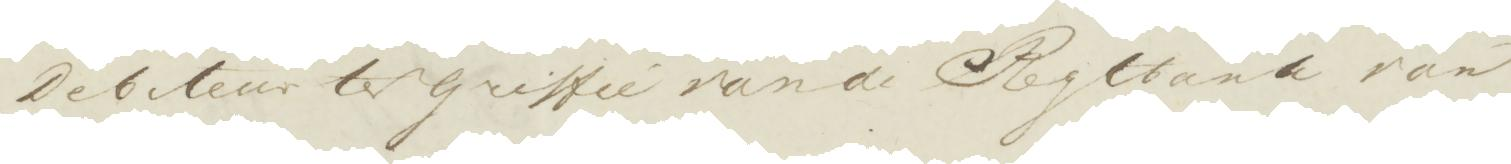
Debiteur ter griffie van de Regtbank van
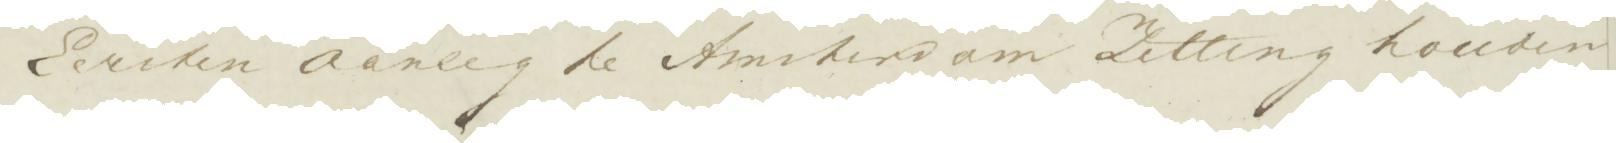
Eersten aanleg te Amsterdam zitting houden
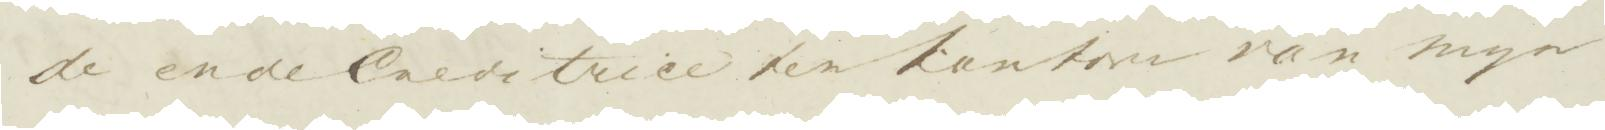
de en de Creditrice ten kantore van myn
